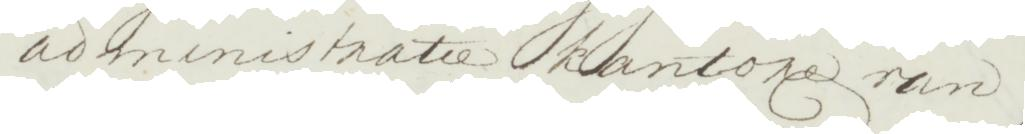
administratie kantore van
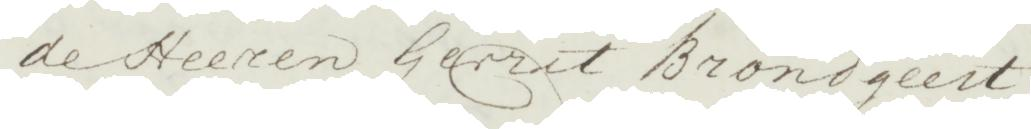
de Heeren Gerrit Brondgeest
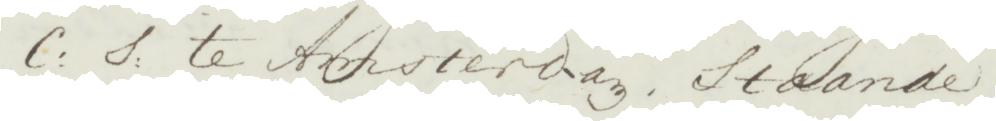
C: S: te Amsterdam, staande
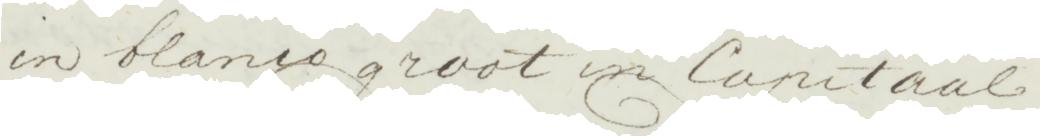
in blanco groot in Capitaal
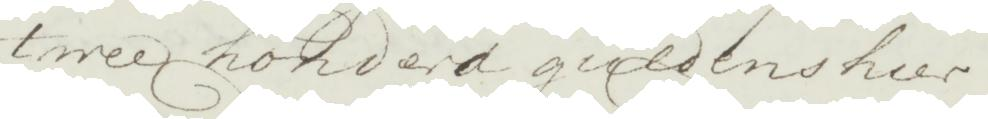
twee honderd guldens hier
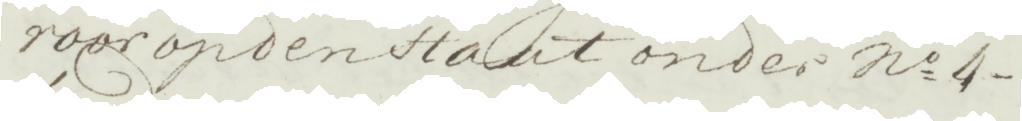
voor op den staat onder N=o 4-
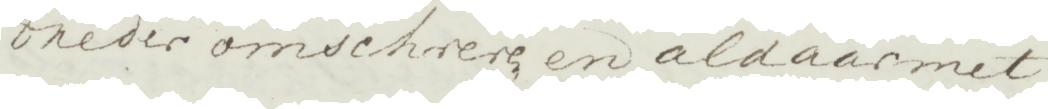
breder omschreven en aldaar met
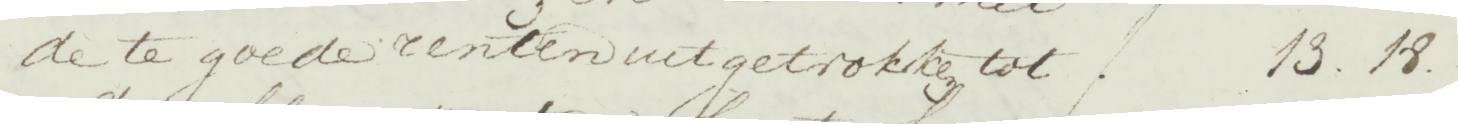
de te goede renten uitgetrokken tot ƒ 13. 18.
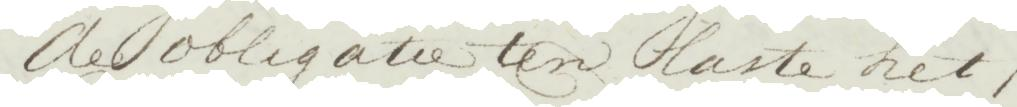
de obligatie ten laste het
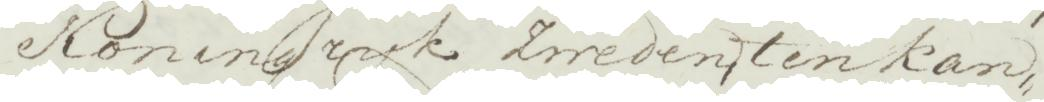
Koningryk Zweden, ten kan„
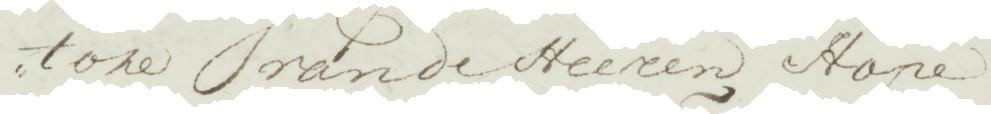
„tore van de Heeren Hope
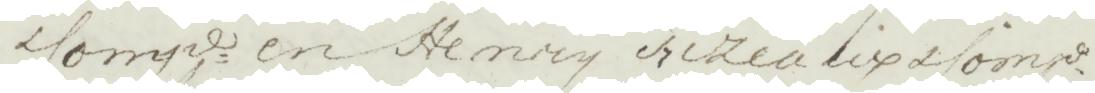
& Comp=e en Henry Fizealix & Comp„e
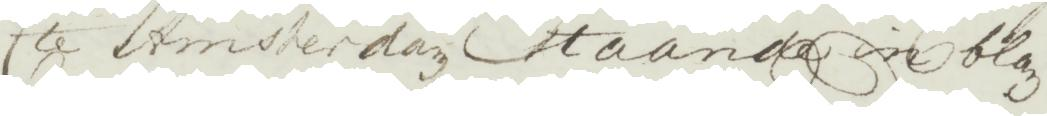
te Amsterdam staande in blan
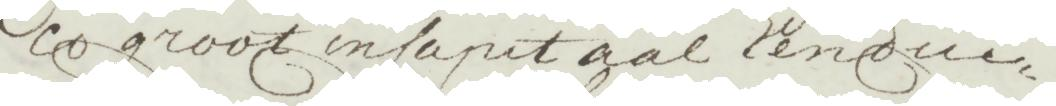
co groot in Capitaal Een dui„
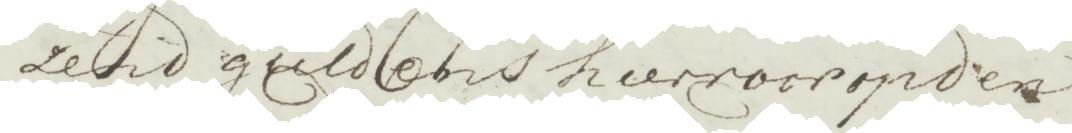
zend guldens hiervoor op den
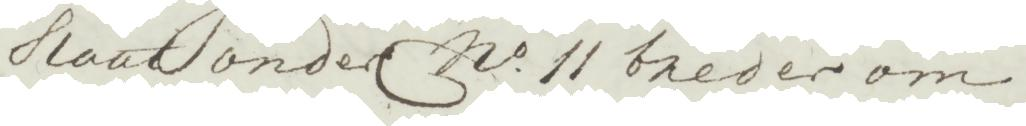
Staat onder N.o 11 breder om
